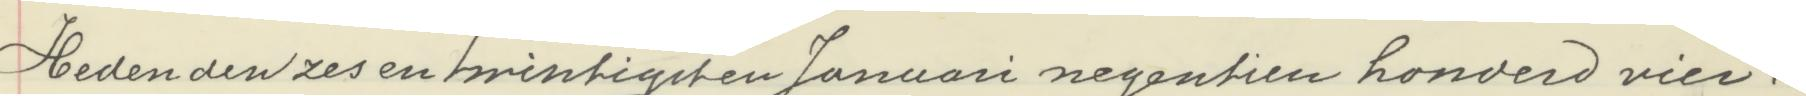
Heden den zes en twintigsten Januari negentien honderd vier.
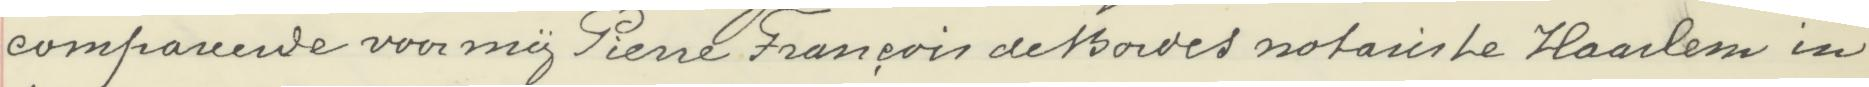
compareerde voor mij Pierre François de Bordes notaris te Haarlem in
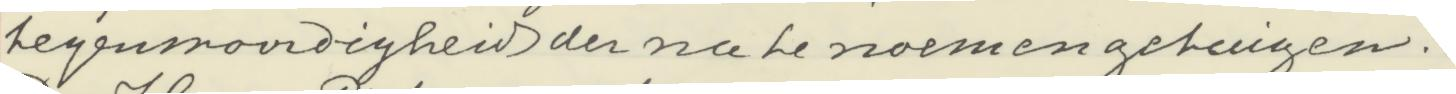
tegenwoordigheid der na te noemen getuigen.
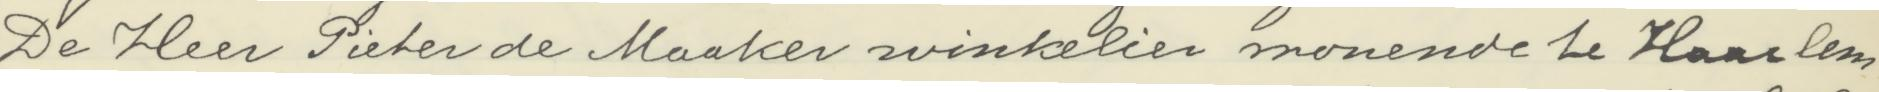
De Heer Pieter de Maaker winkelier wonende te Haarlem
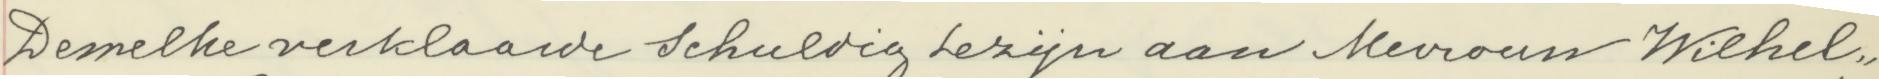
Dewelke verklaarde schuldig tezijn aan Mevrouw Wilhel„
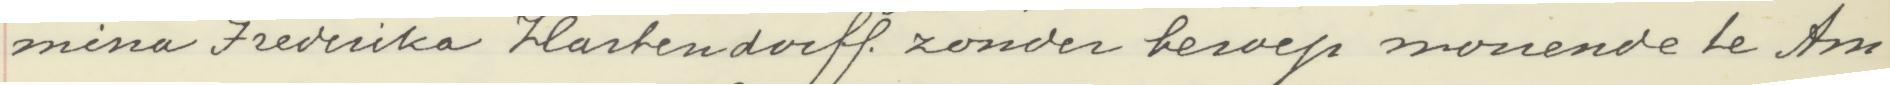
mina Frederika Hartendorff. zonder beroep wonende te Am
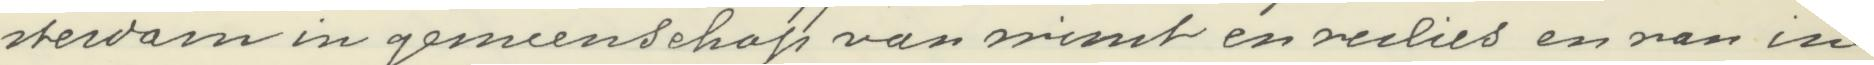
sterdam in gemeenschap van winst en verlies en van in
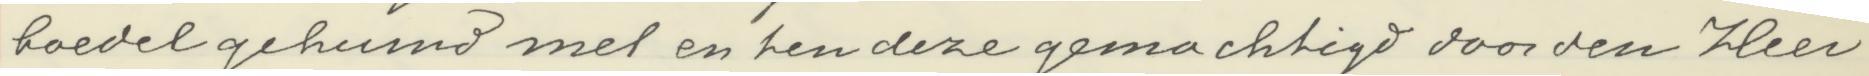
boedel gehuwd met en ten deze gemachtigd door den Heer
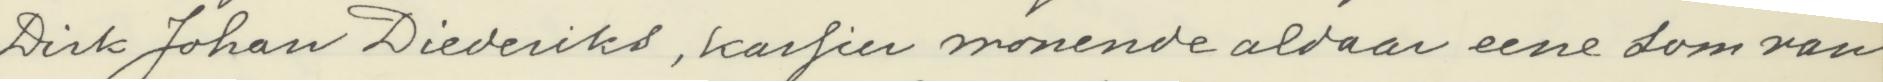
Dirk Johan Diederiks, kassier wonende aldaar eene som van
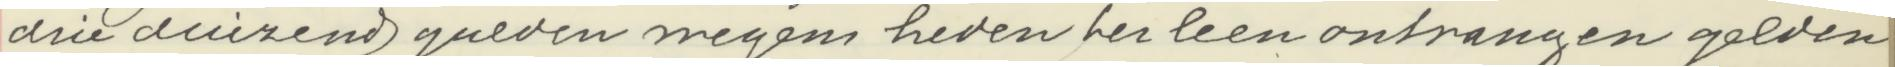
drie duizend gulden wegens heden ter leen ontvangen gelden
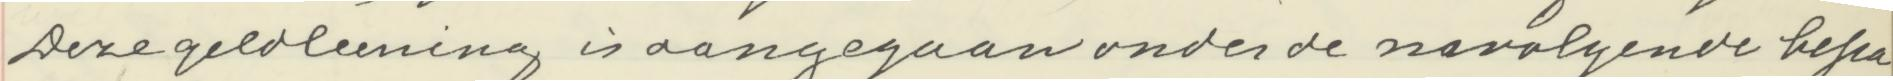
Deze geldleening is aangegaan onder de navolgende bepa
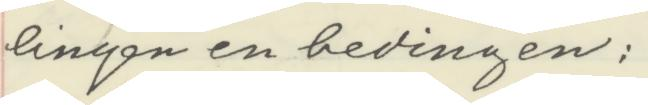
lingen en bedingen:
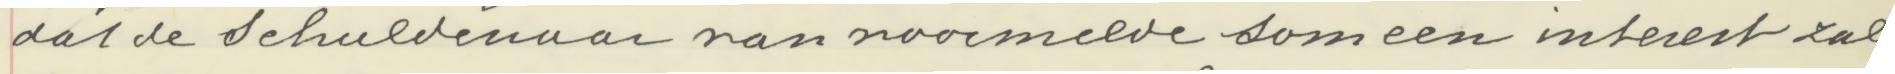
dat de schuldenaar van voormelde som een interest zal
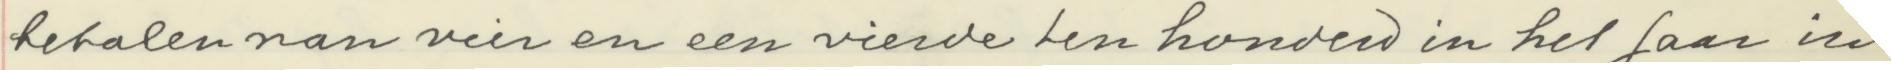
betalen van vier en een vierde ten honderd in het Jaar in-
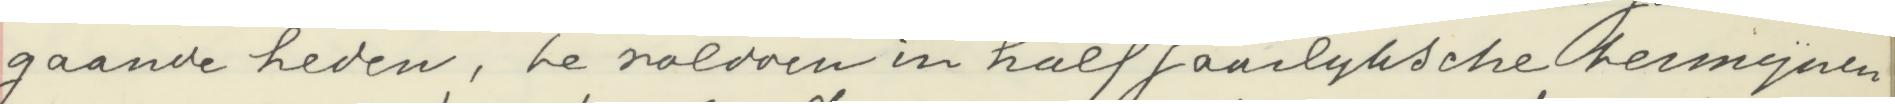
gaande heden, te voldoen in half jaarlyksche termijnen
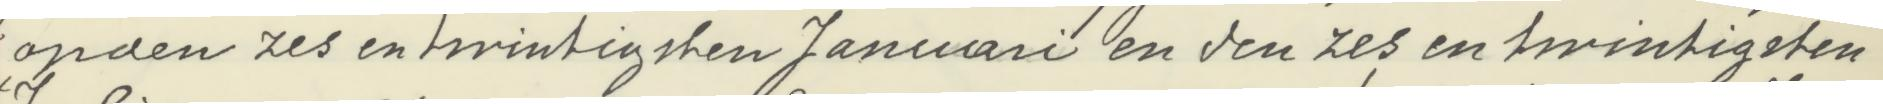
op den zes en twintigsten Januari en den zes en twintigsten
